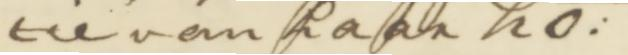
tie van haar ho:
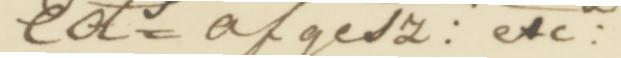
Ed=s afgesz: etc:a
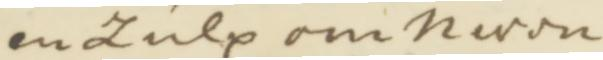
en Zulx om neven
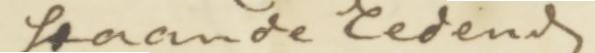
staande Redenen
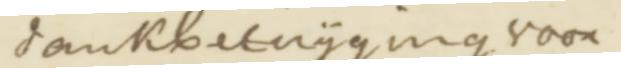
dank betuijging voor
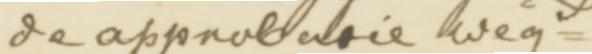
de approbatie weg=s
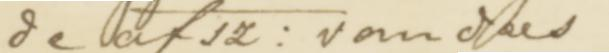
de afsz: van dees
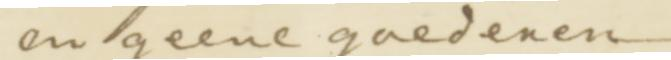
en geene goederen
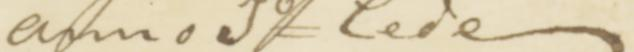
anno I=o lede
